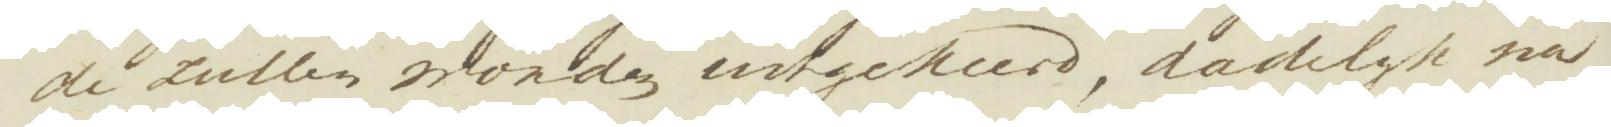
de zullen worden uitgekeerd, dadelyk na
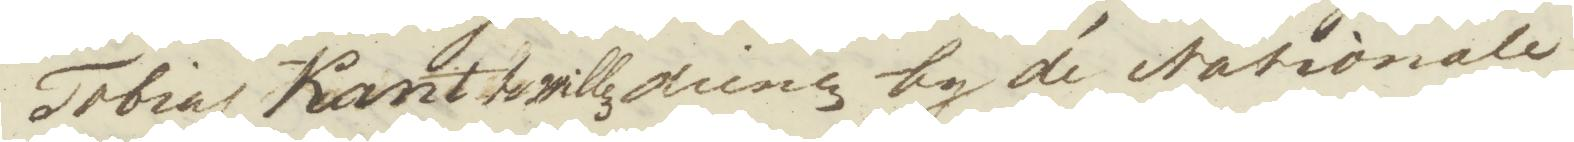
Tobias Kant te willen dienen by de Nationale
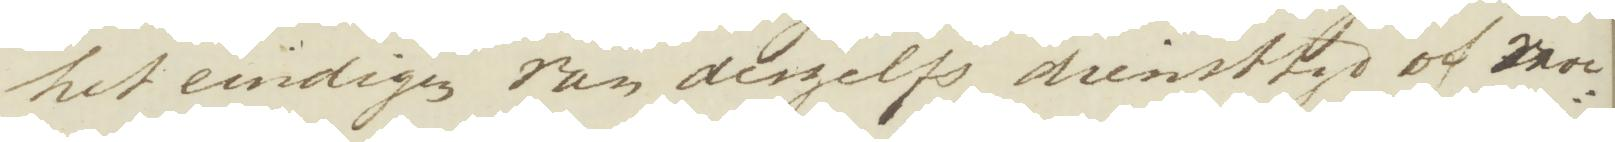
het eindigen van deszelfs diensttyd of vroe=
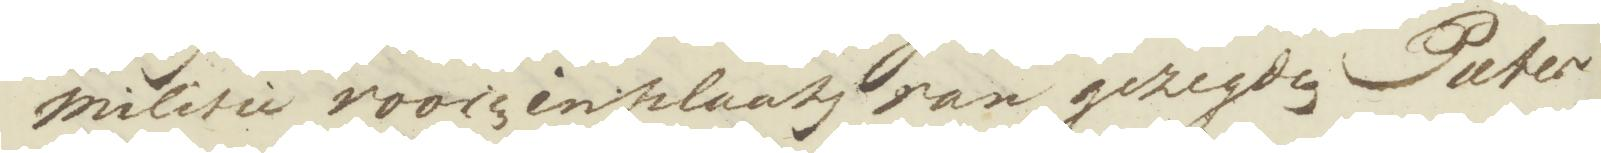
militie voor en inplaats van gezegden Pieter
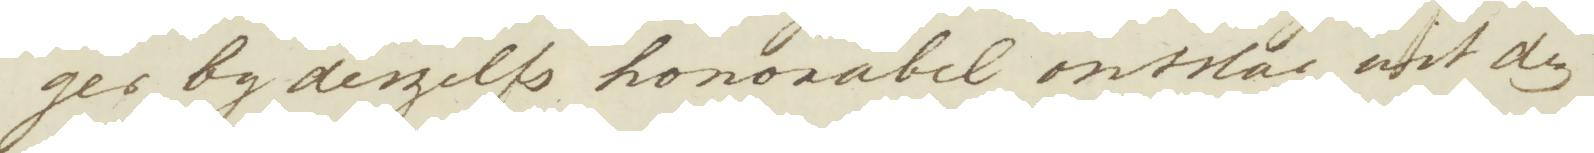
=ger by deszelfs honorabel ontslag uit den
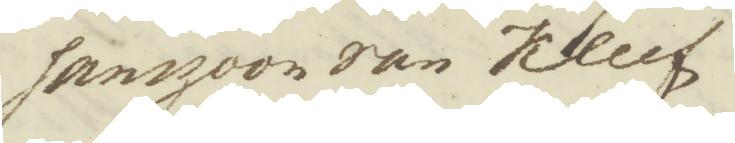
Janszoon van Kleef
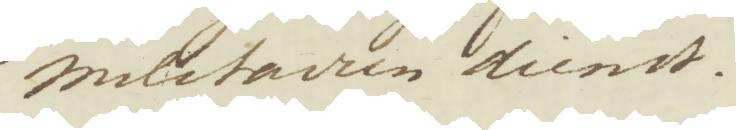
militairen dienst.
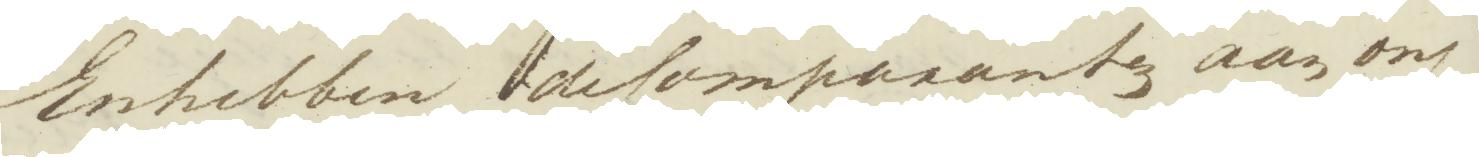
En hebben de Comparanten aan ons
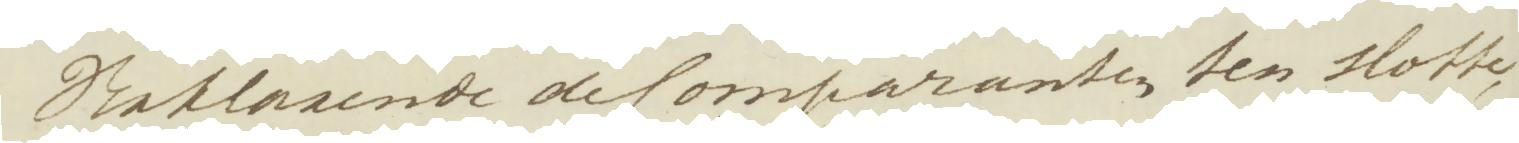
Verklarende de Comparanten ten slotte,
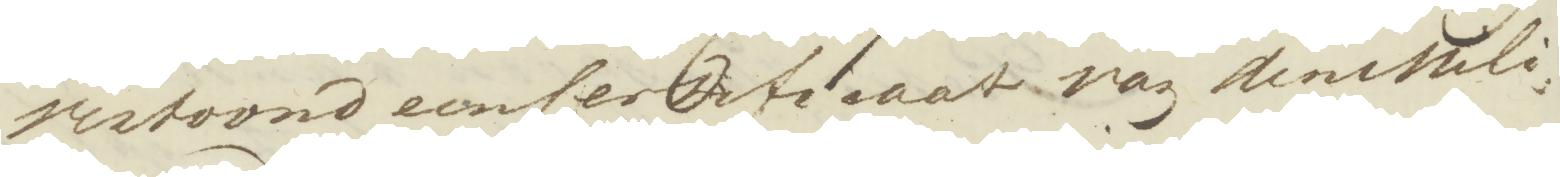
vertoond een Certificaat van den mili=
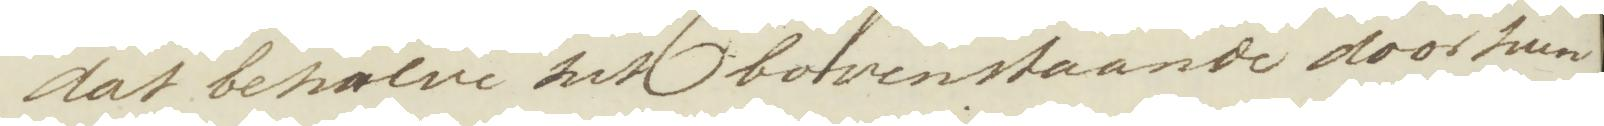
dat behalve het bovenstaande door hun
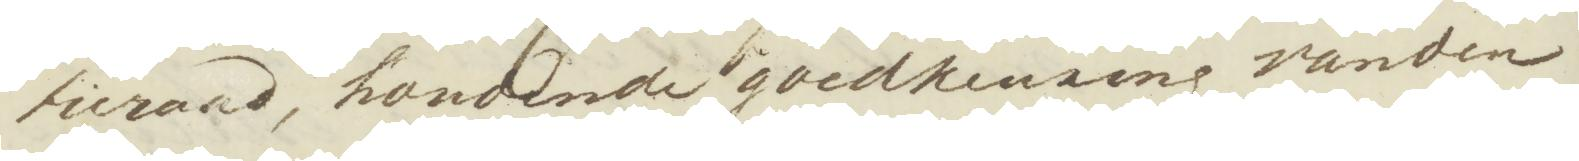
=tieraad, houdende goedkeuring van den
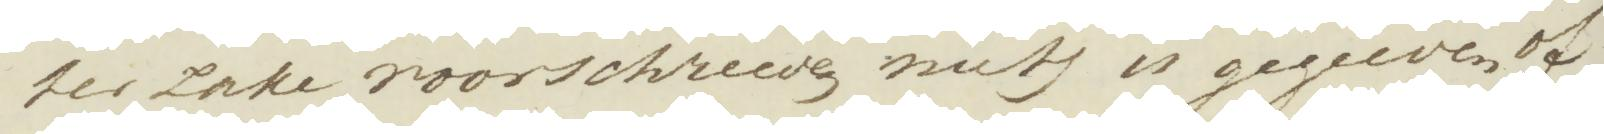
ter zake voorschreeven niets is gegeeven of
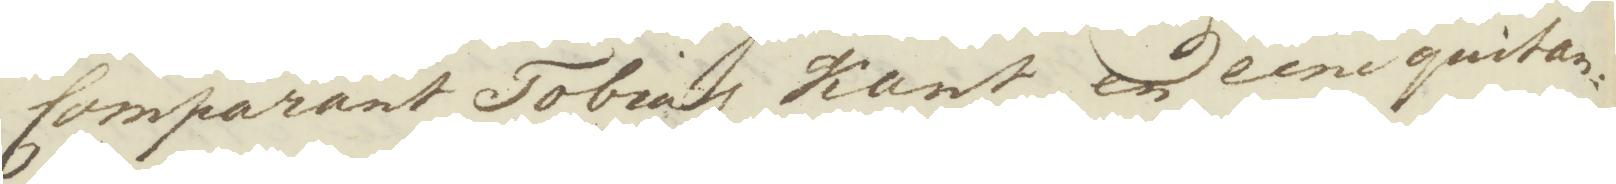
Comparant Tobias Kant, en eene quitan:
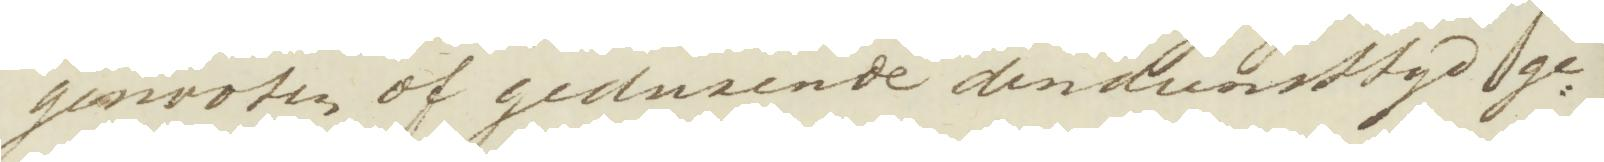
genooten of gedurende den diensttyd ge:
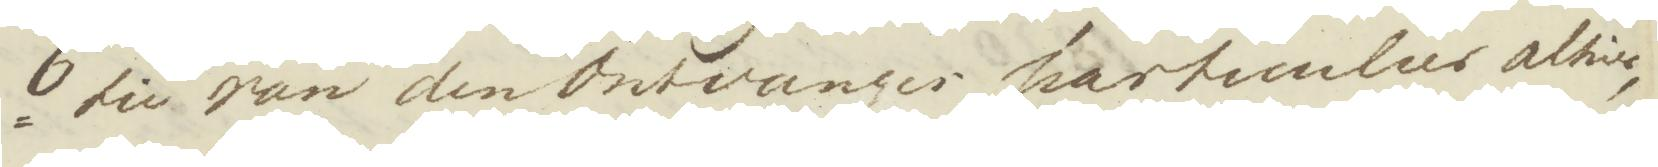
=tie van den ontvanger particulier alhier,
